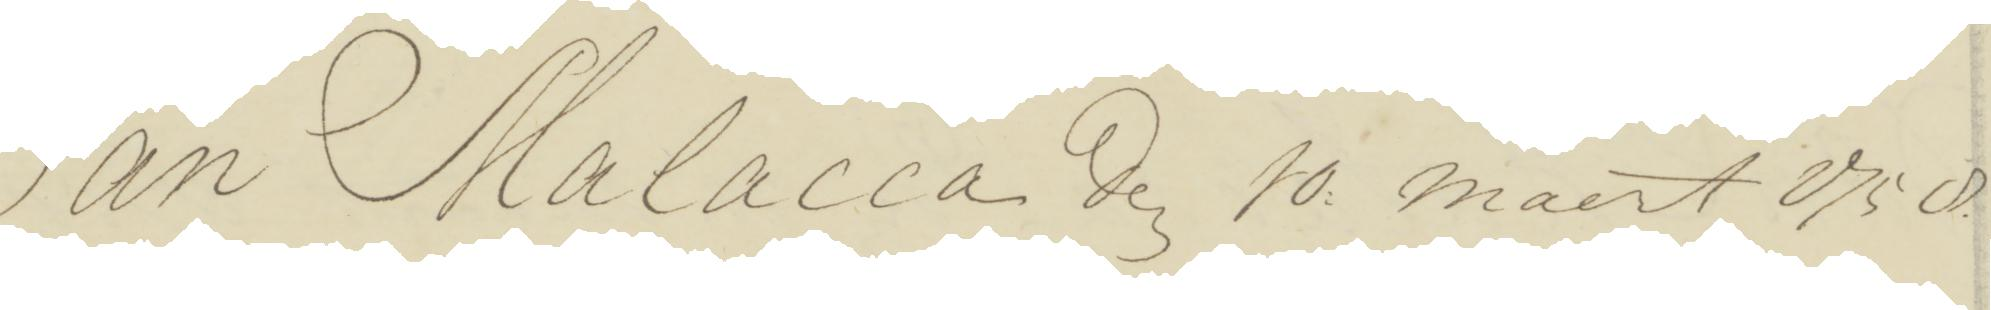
Van Malacca den 10: maert 1758
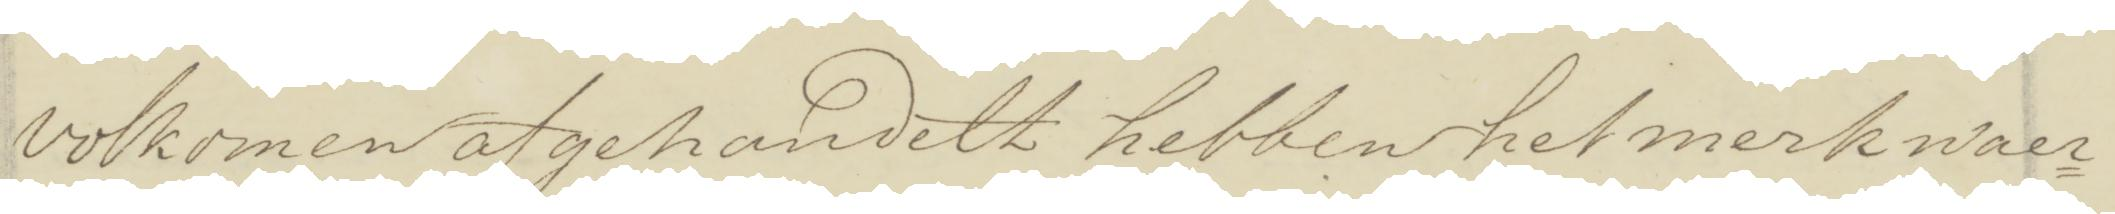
volkomen afgehandelt hebben het merk waer„
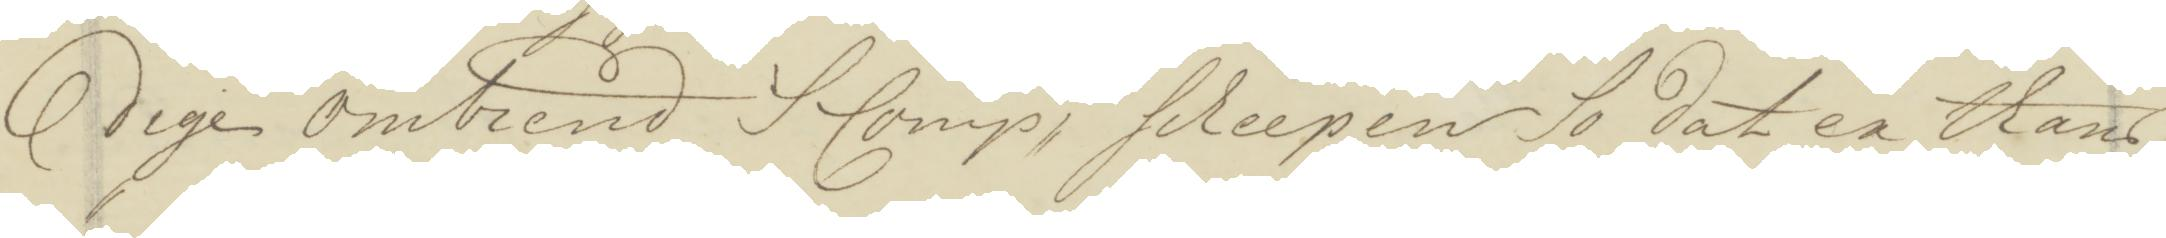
dige omtrend ’s Comp„s scheepen so dat er thans
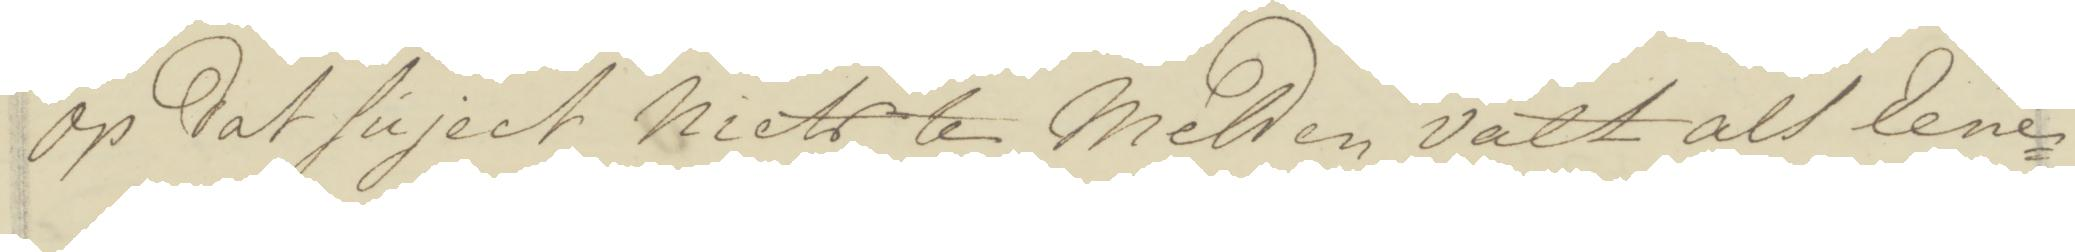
op dat suject niets te melden valt als Eene=
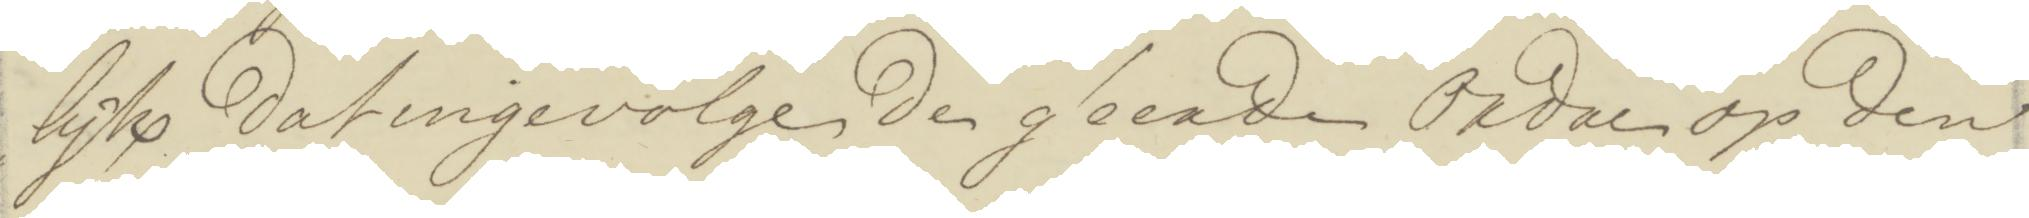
lijk dat ingevolge de g'eerde ordre op den
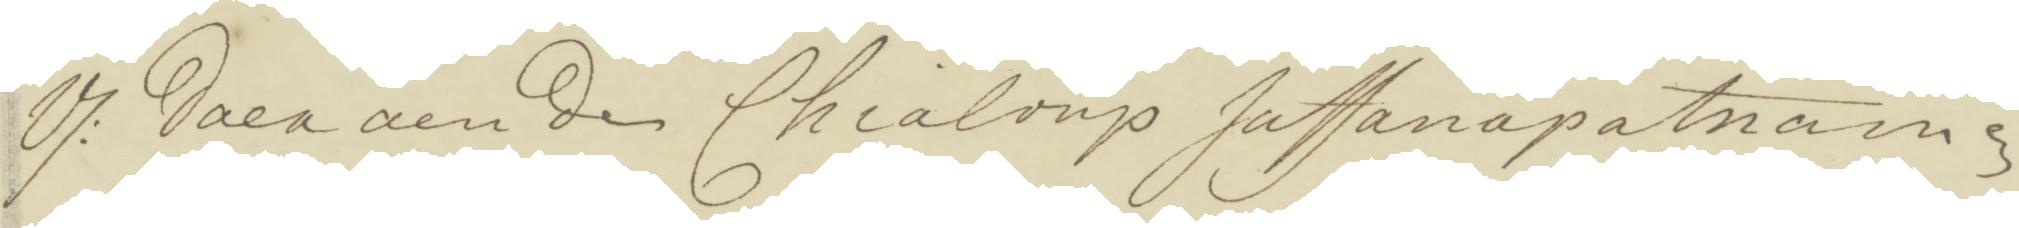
17: daer aen de Chialoup Jaffanapatnam en
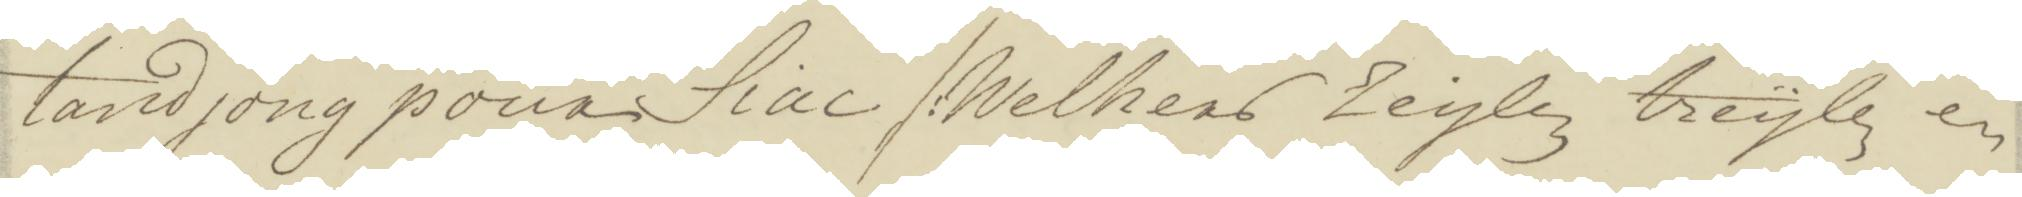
tandjong pour Siac /: Welkers zeijlen treijlen en
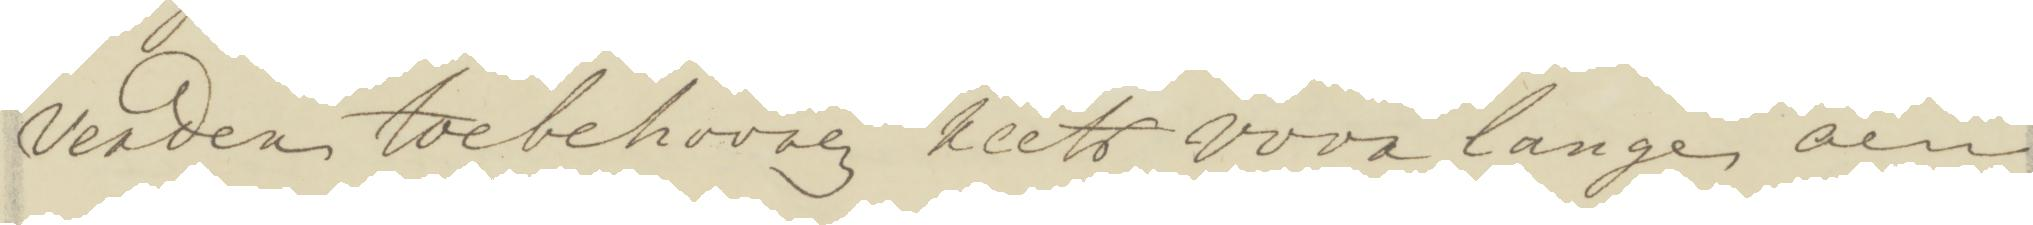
verder toebehooren reets voor lange aen
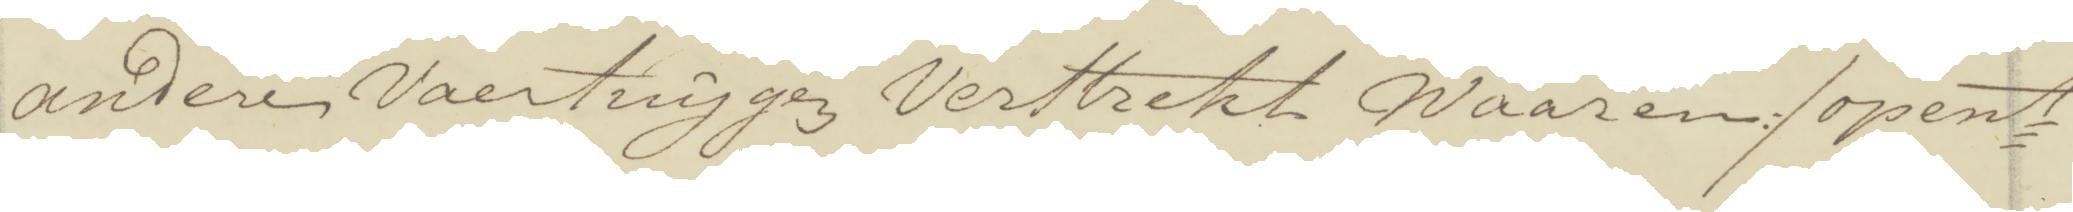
andere vaertuijgen verstrekt waaren :/ open=t
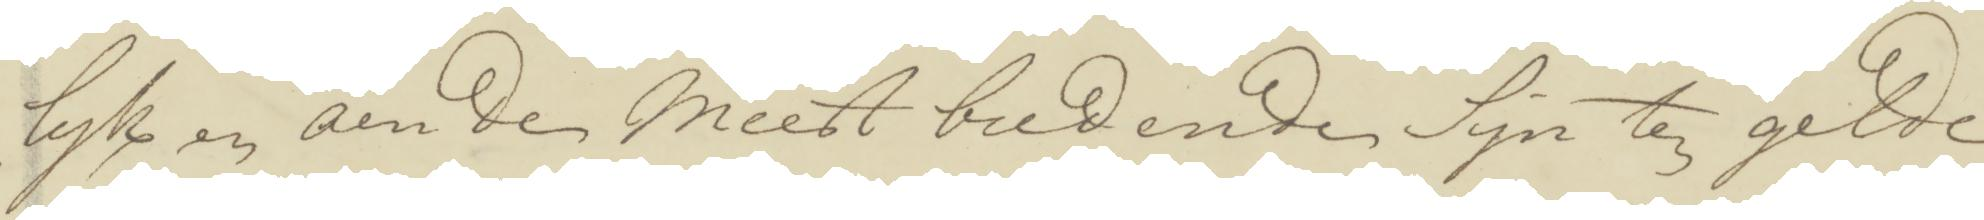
„lyk aen de meest biedende sijn ten gelde
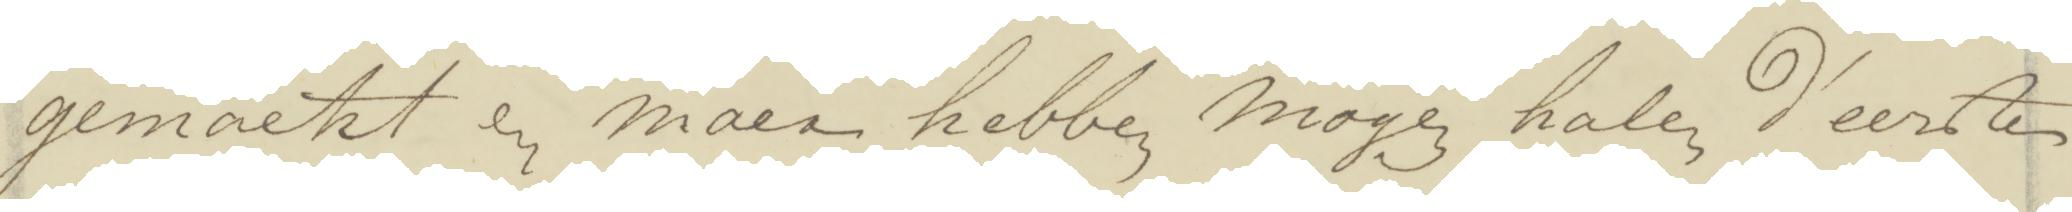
gemaekt en maer hebben mogen halen d’eerste
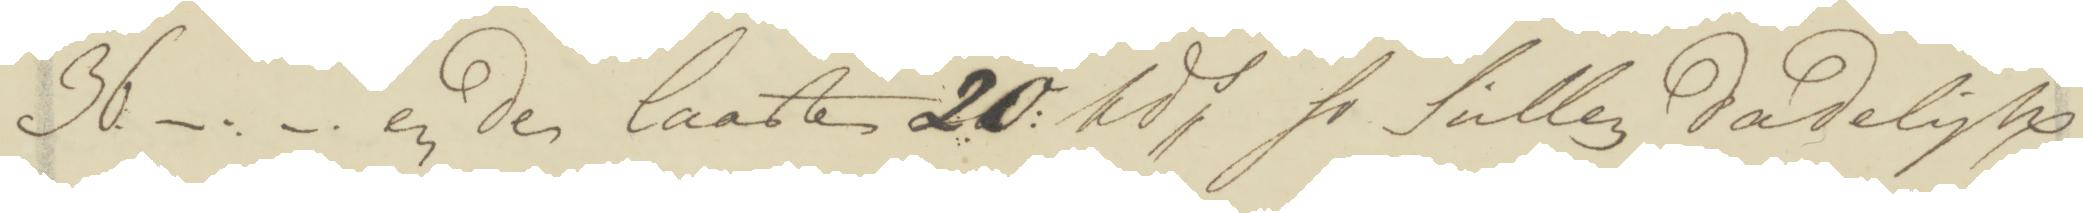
36. –: –. en den laaste 20: rd„s so sullen dadelijk
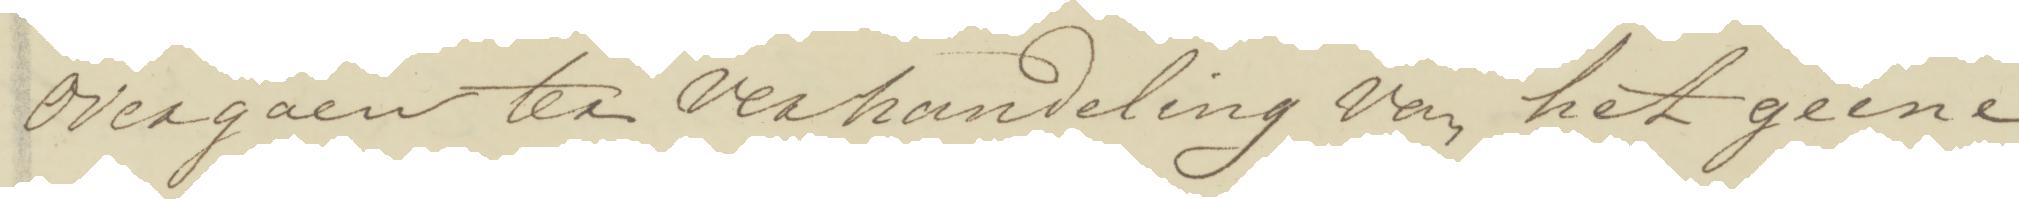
overgaen ter verhandeling van het geene
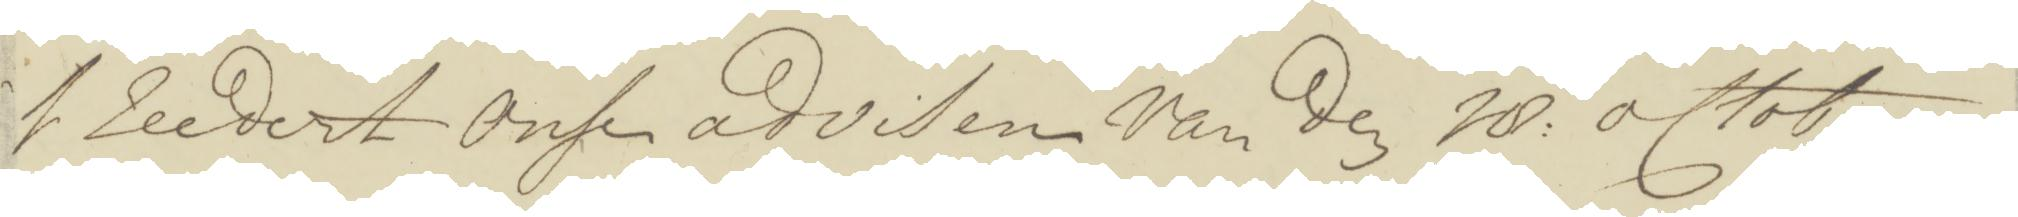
't zeedert onse advisen van den 28: october
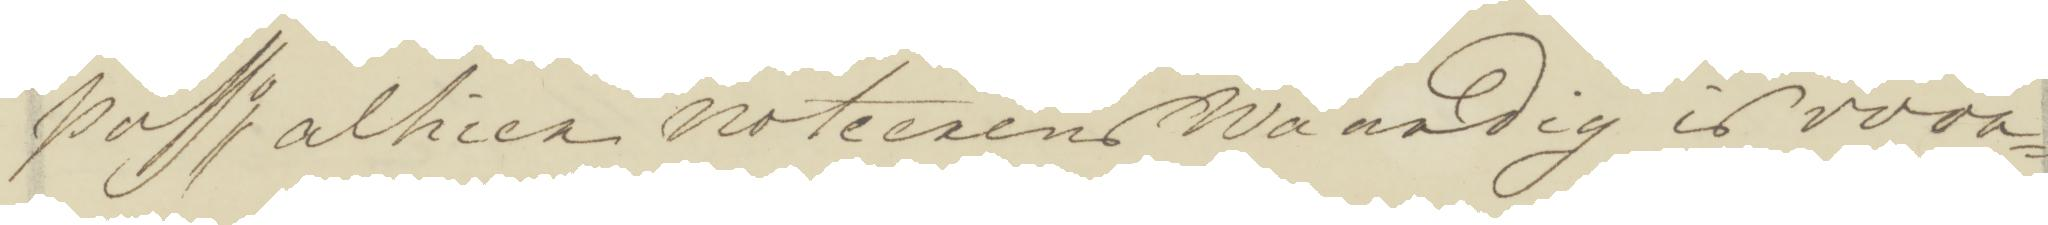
pass„o alhier noteeren waardig is voor=
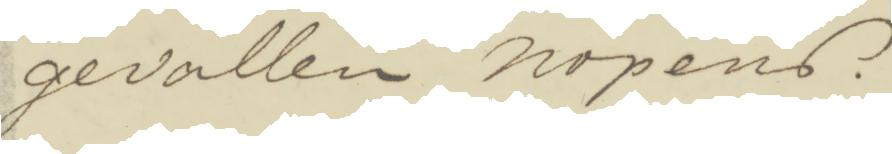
gevallen nopens.
